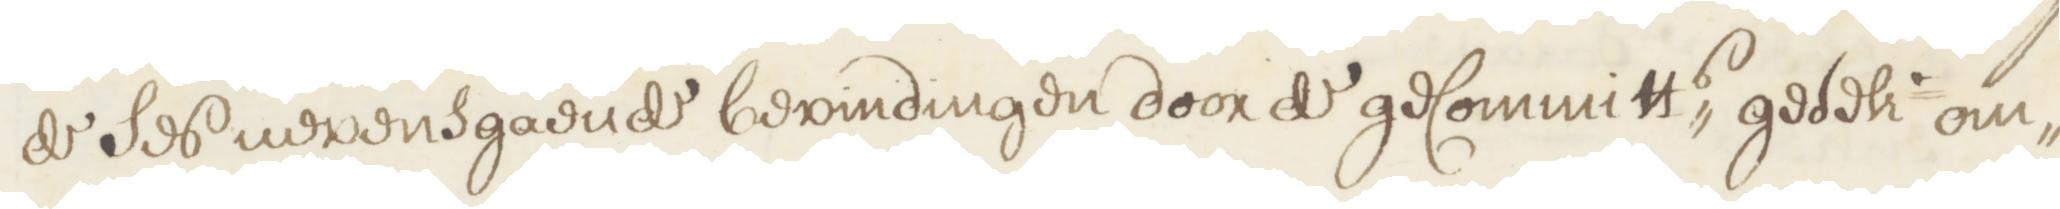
de ses nevensgaende bevindingen door de gecommitt„s getek=t om„
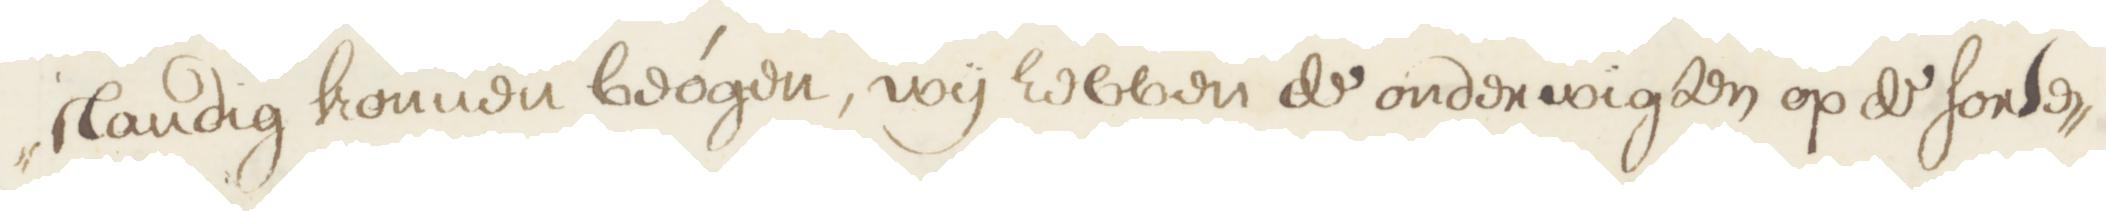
„standig konnen beogen, wij hebben de onderwigten op de sorte„
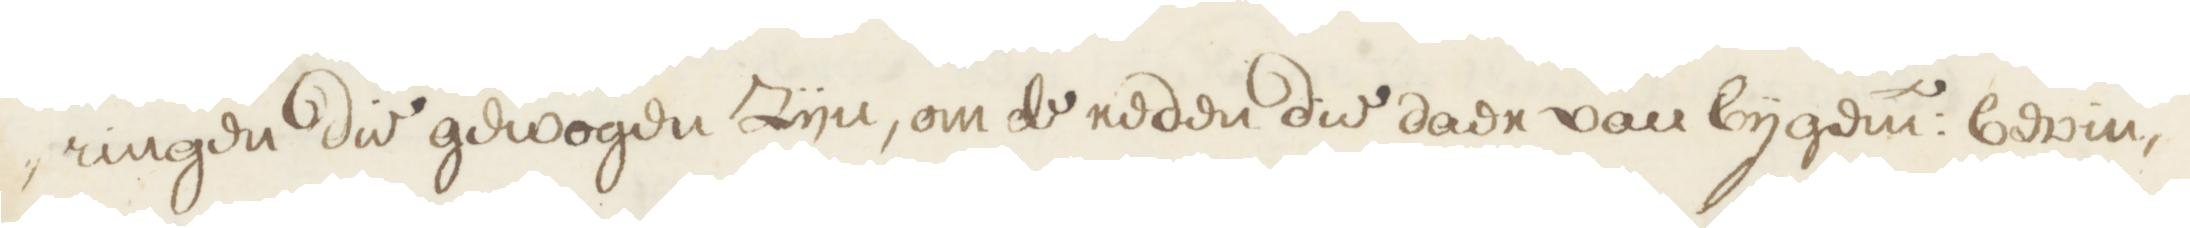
„ringen die gewogen zijn, om de reden die daer van bij gem:te bevin„
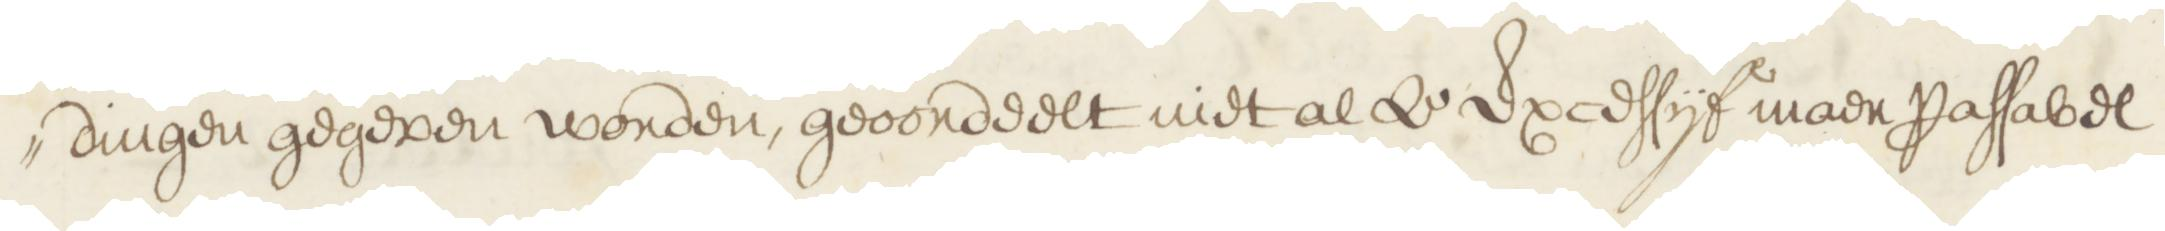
„dingen gegeven worden, geoordeelt niet al te Excessijf maer passabel
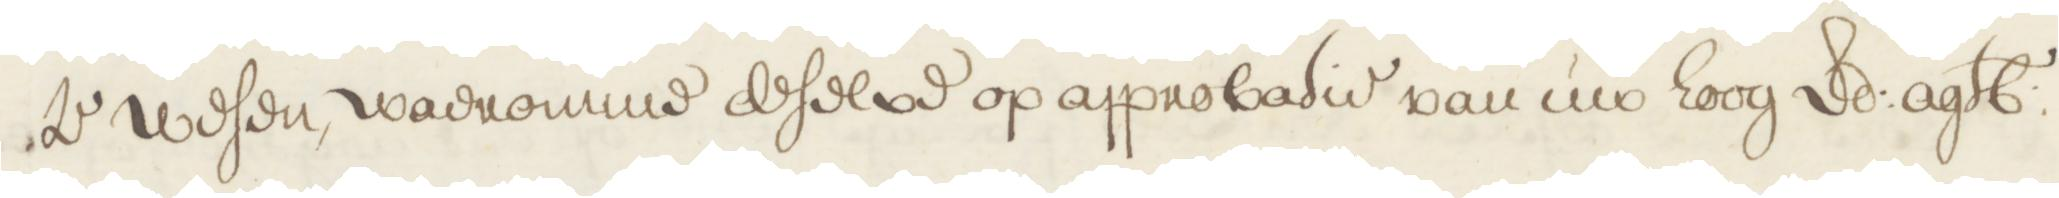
te wesen, waeromme deselve op approbatie van uw hoog Ed: agtb:
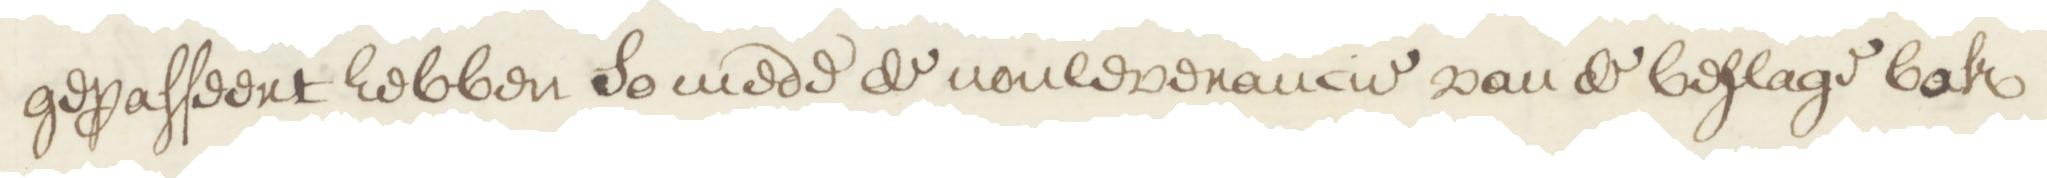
gepasseert hebben so mede de nonleverancie van de beslage bak
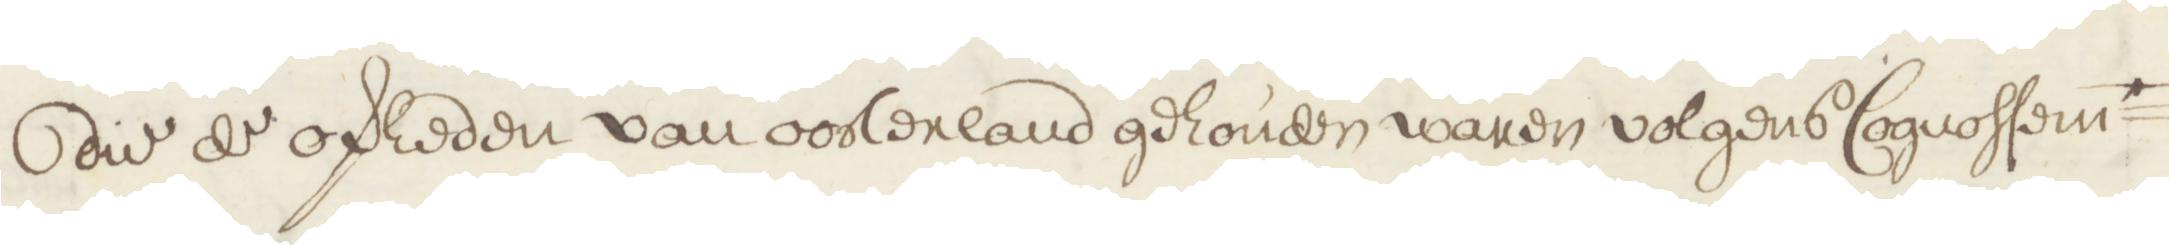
die de overheden van oosterland gehouden waren volgens Cognossem=t
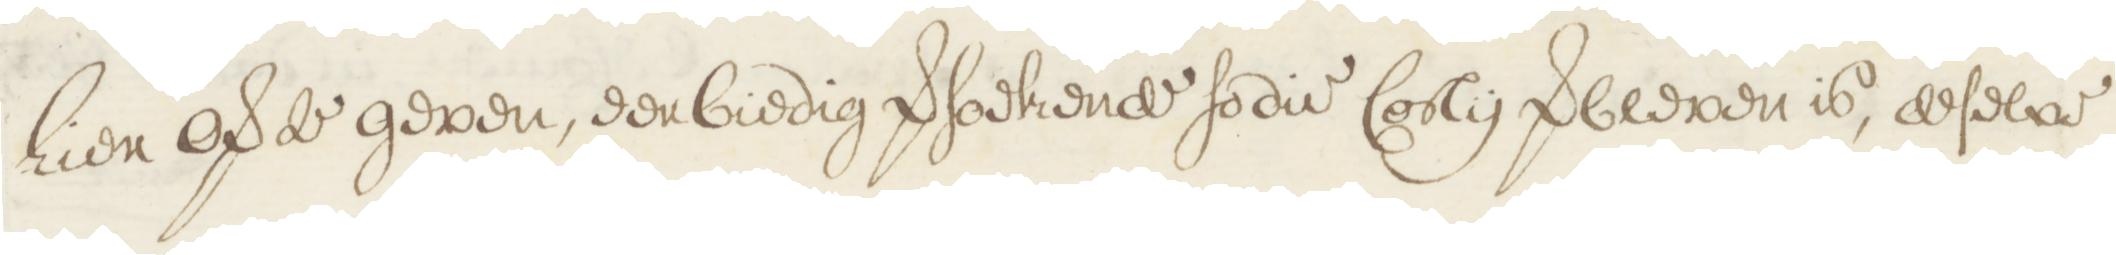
hier over te geven, eerbiedig versoekende so die Costij verbleven is, deselve
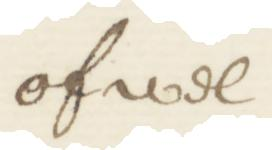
of wel
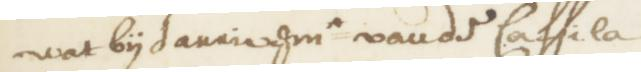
wat bij 't arrivem=t van de Caffila
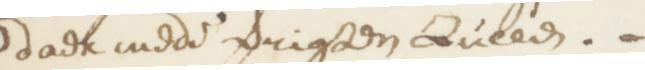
daer mede verrigten zullen. —
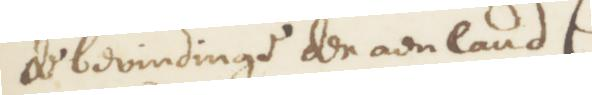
de bevindinge der aen land
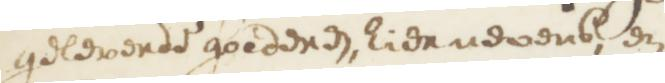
geleverde goederen, hier nevens, en
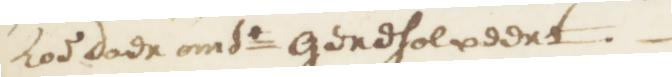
hoe daer omt=t geresolveert. —
